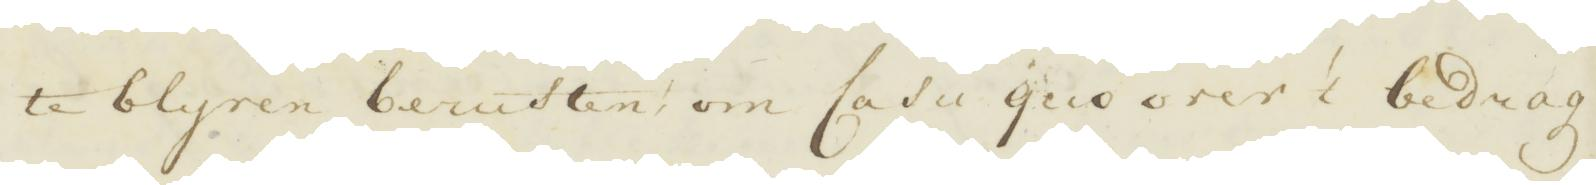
te blyven berusten om Casu quo over ’t bedrag
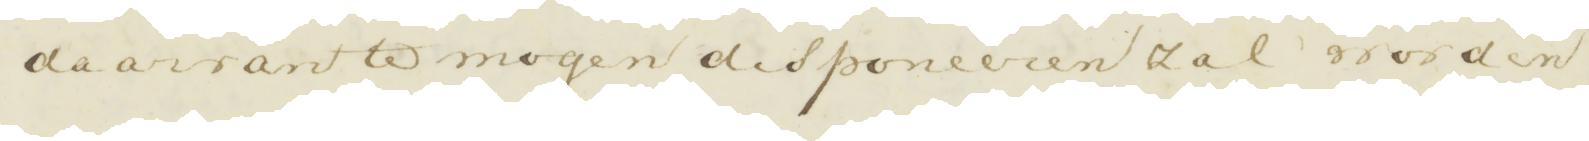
daarvan te mogen disponeeren zal worden
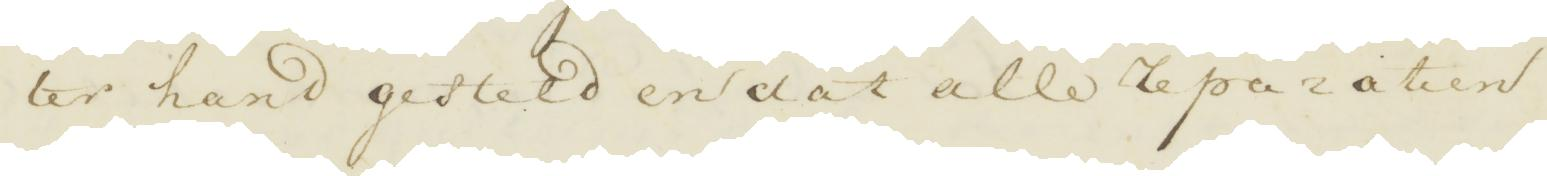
ter hand gesteld en dat alle reparatien
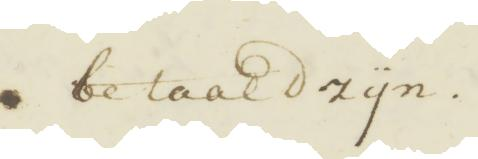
betaald zijn.
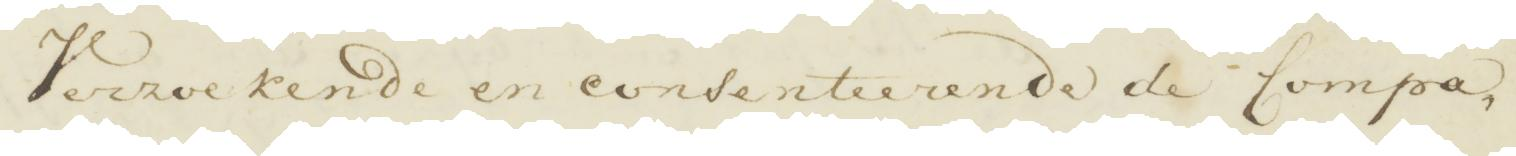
Verzoekende en consenteerende de Compa„
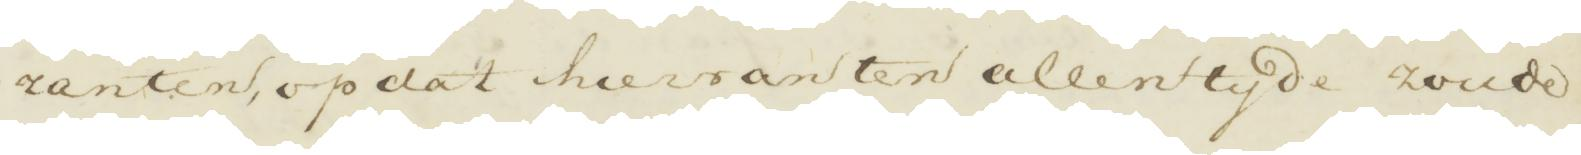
ranten, op dat hiervan ten allen tyde zoude
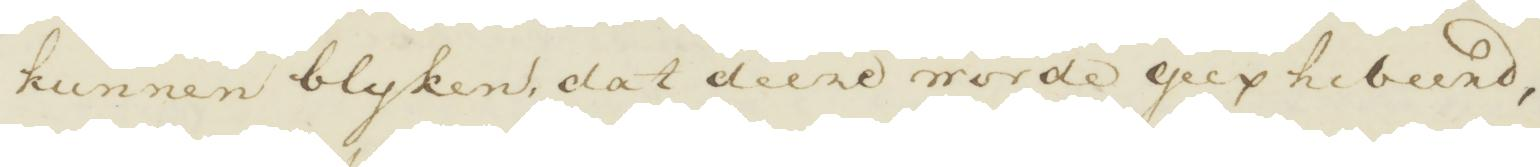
kunnen blyken, dat deeze worde geexhibeerd,
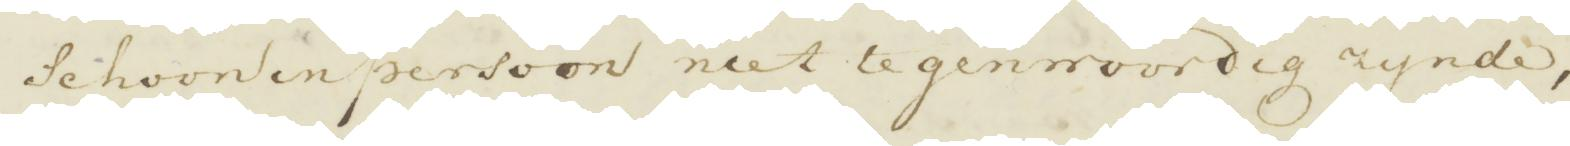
schoon in persoon niet tegenwoordig zynde,
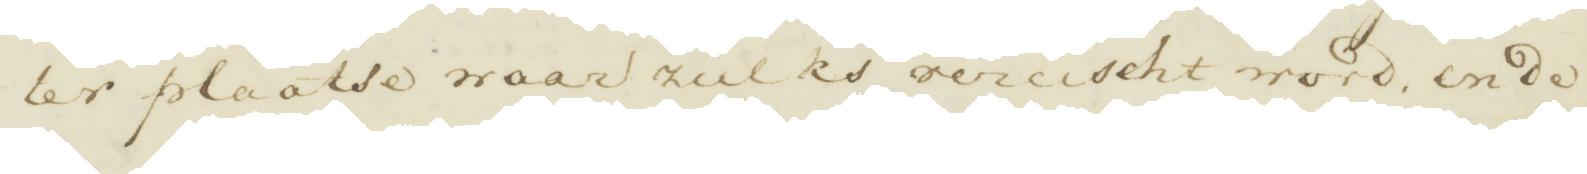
ter plaatse waar zulks vereischt word, en de
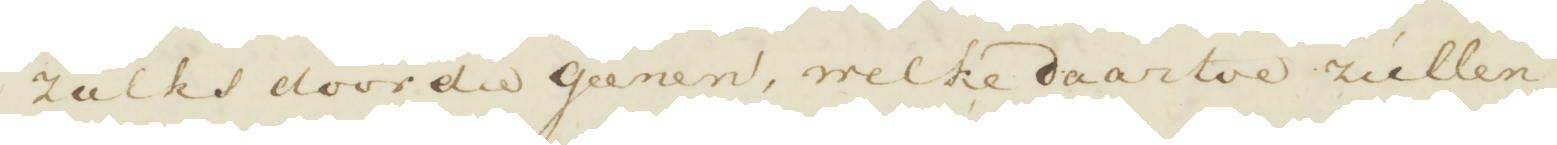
zulks door die geenen, welke daar toe zullen
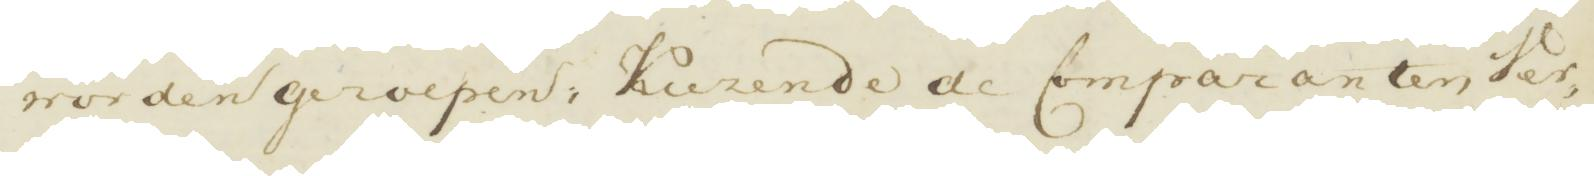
worden geroepen; Kiezende de comparanten Ver„
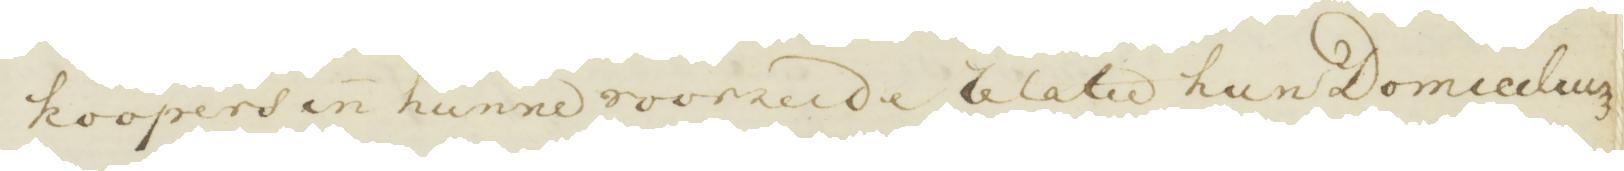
koopers en hunne voorzeide relatie hun Domicilium
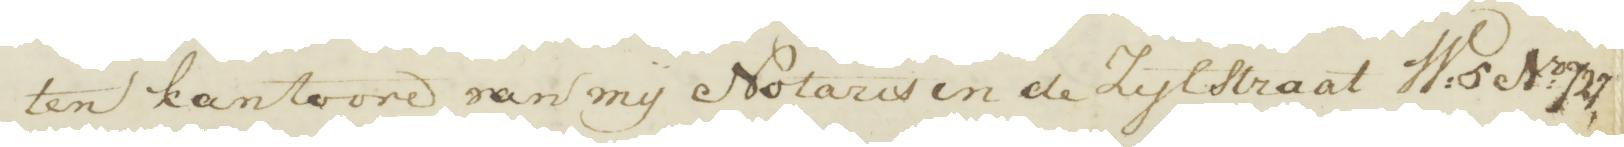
ten kantoore van mij Notaris en de Zijlstraat W:5 N:o 727,
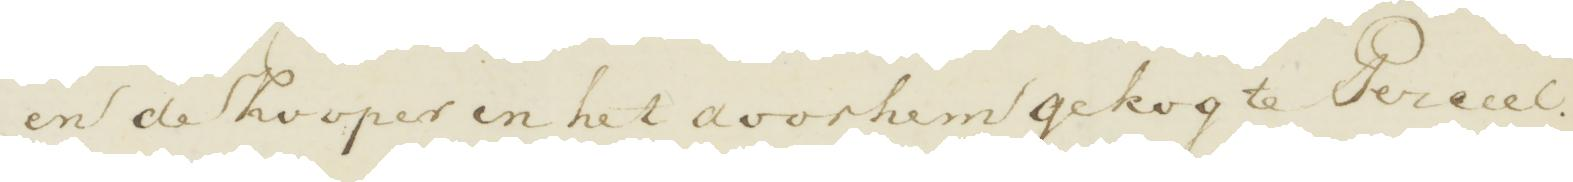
en de kooper en het door hem gekogte Perceel.
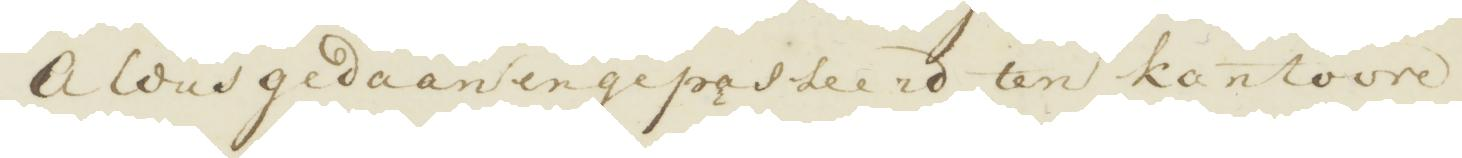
Aldus gedaan en gepasseerd ten kantoore
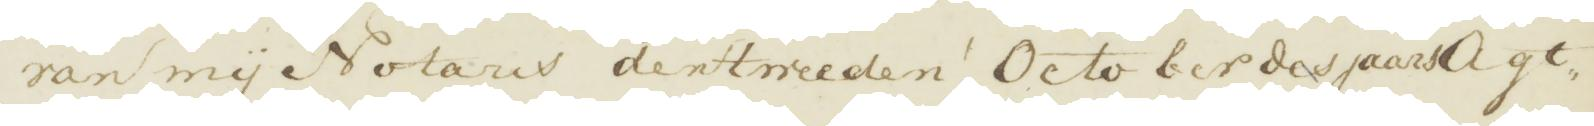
van mij Notaris den tweeden October des jaars Agt„
